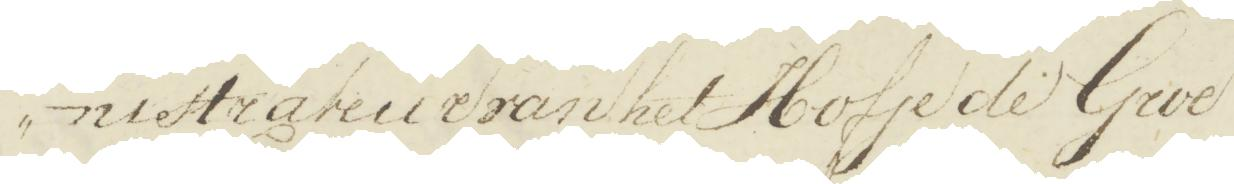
„nistrateur van het Hofje de Groe
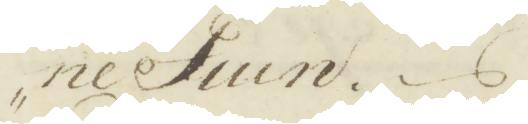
„ne Tuin.
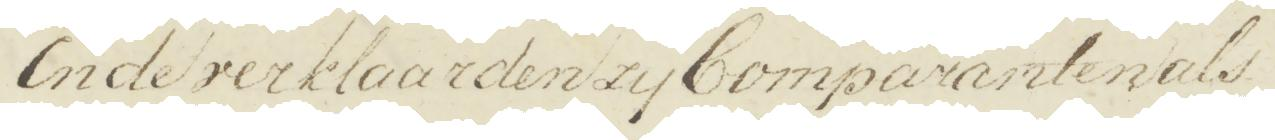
Ende verklaarden zy Comparanten als
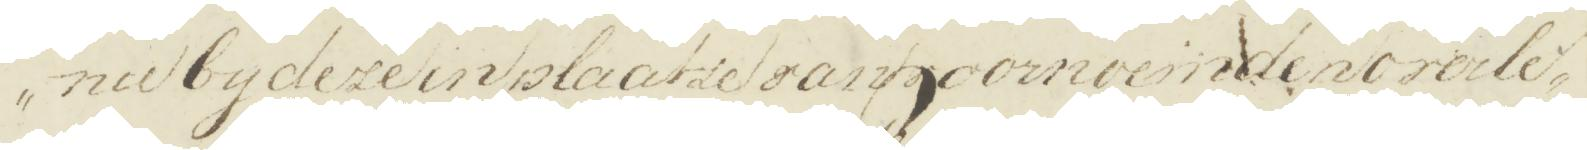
„na bij deze in plaatse van voornoemden overle„
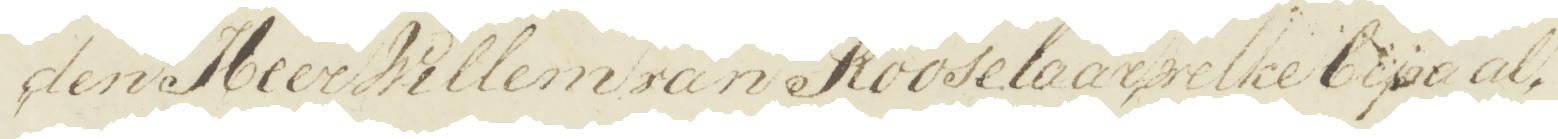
„den Heer Willem van Rooselaar, welke bepaal„
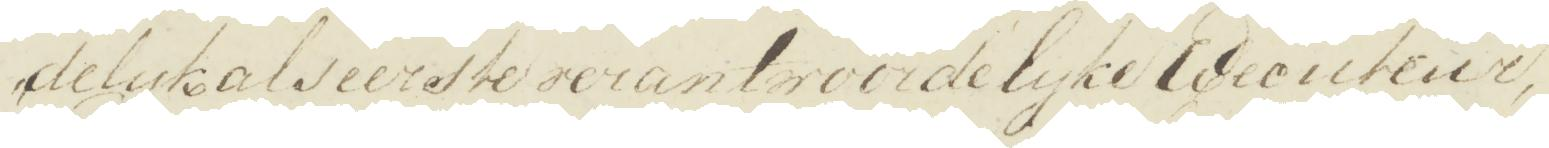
„delyk als eerste verantwoordelyke Executeur,
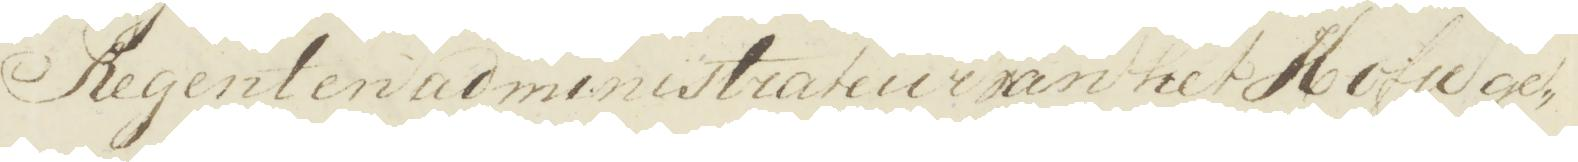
Regent en administrateur van het Hofje ge„
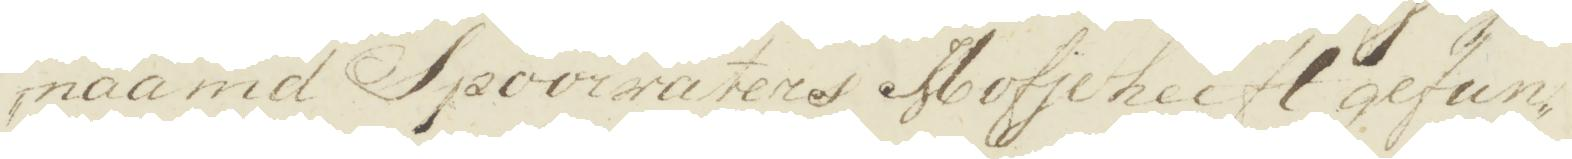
„naamd Spoorwaters Hofje heeft gefun„
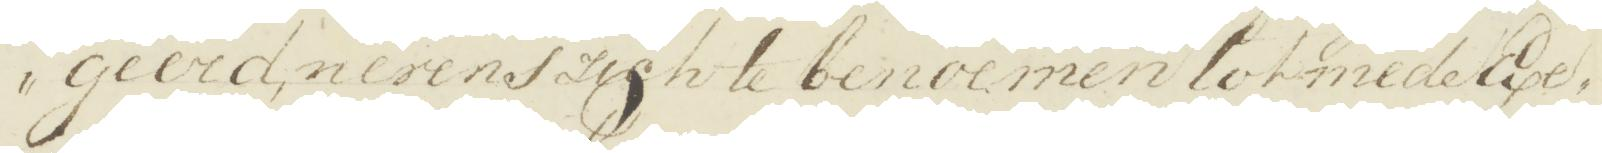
„geerd, nevens zich te benoemen tot mede Exe„
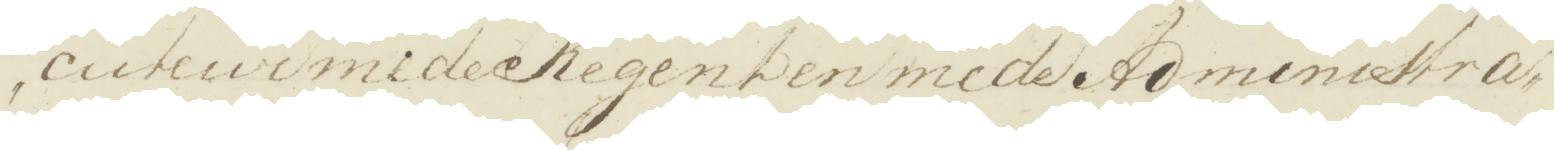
„cuteur mede Regent en mede Administra„
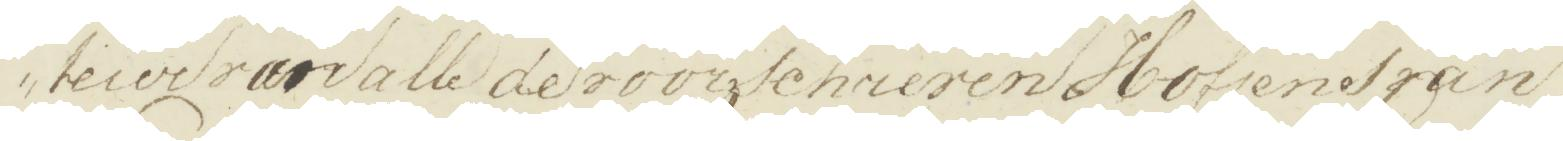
„teur van alle de voorschreven Hofjens van
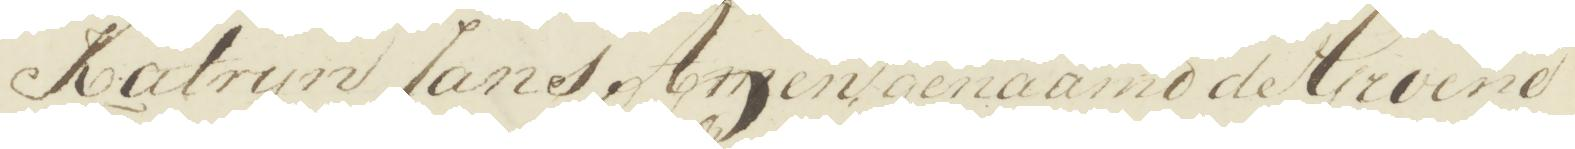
Katryn Jans Amen, genaamd de Groene
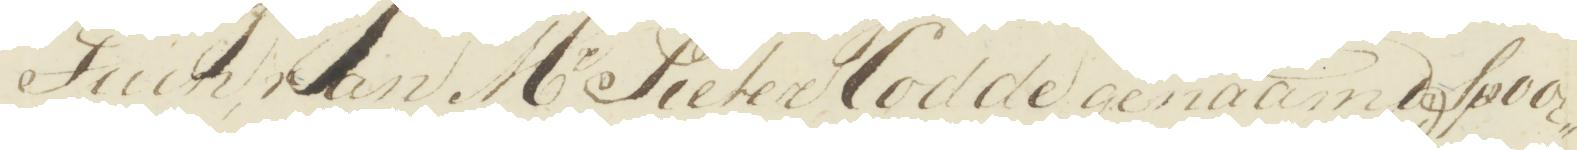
Tuin, van Mr Pieter Codde genaamd spoor„
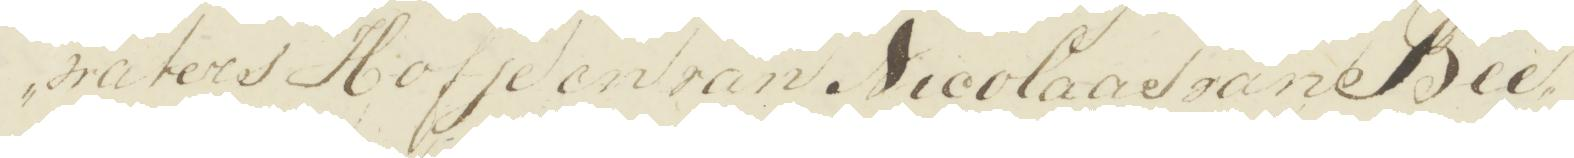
„waters Hofje en van Nicolaas van Bee„
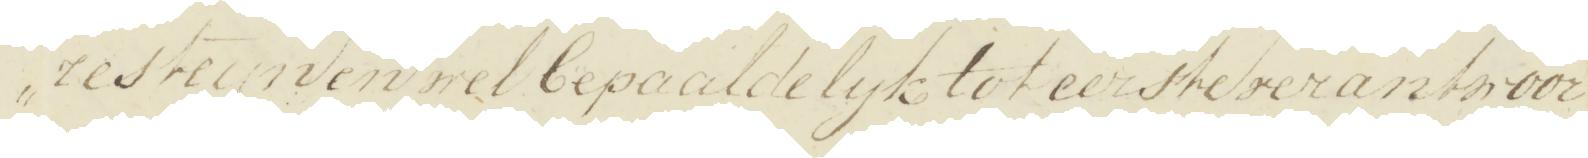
„resteyn en wel bepaaldelyk tot eerste verantwoor
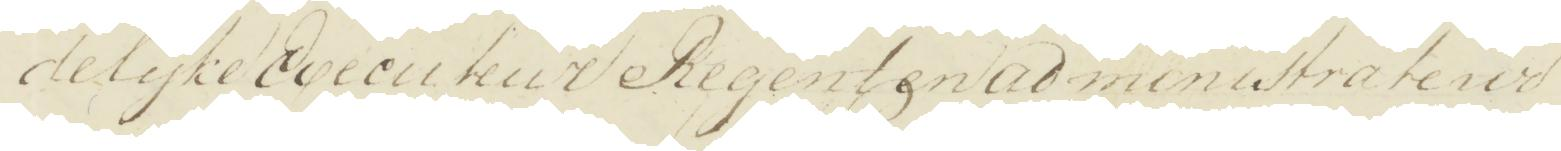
delyke Executeur Regent en administrateur
